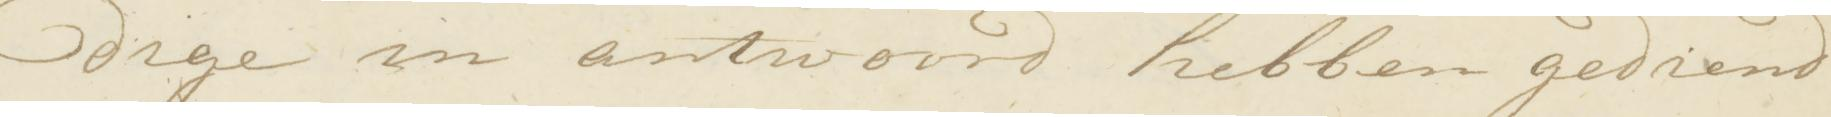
dige in antwoord hebben gediend
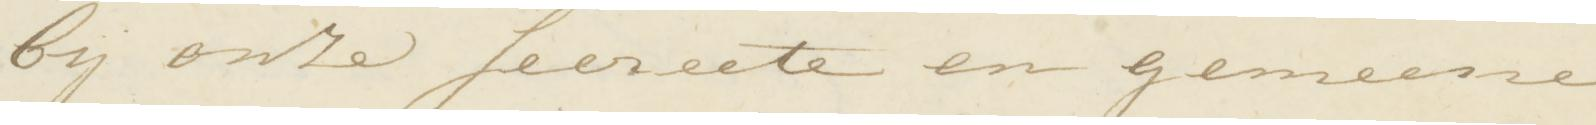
bij onze secreete en gemeene
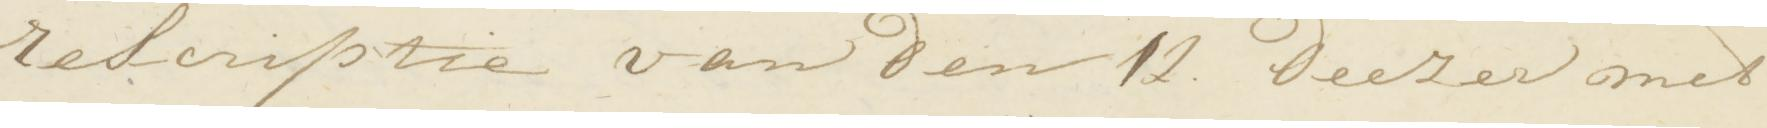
rescriptie van den 12. deezer met
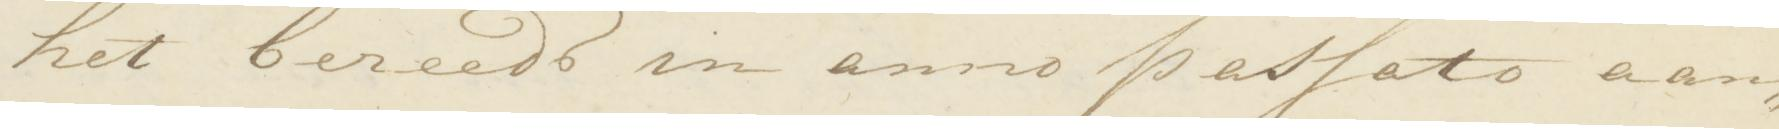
het bereeds in anno passato aan„
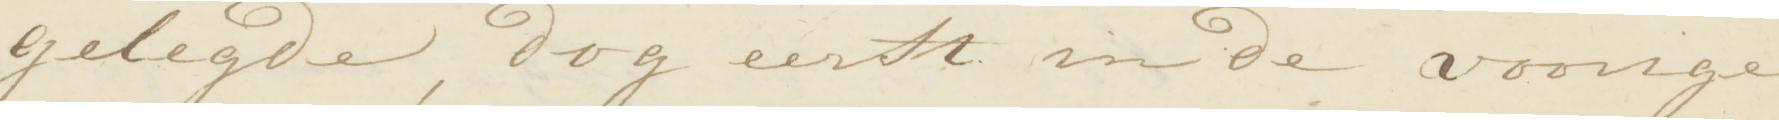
gelegde, dog eerst in de voorige
